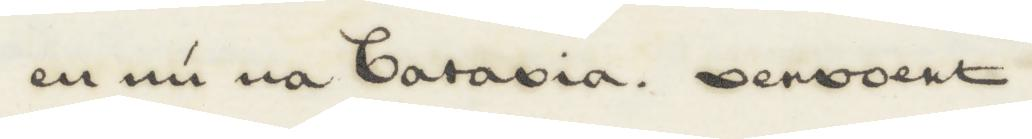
en nu na batavia. vervoert
